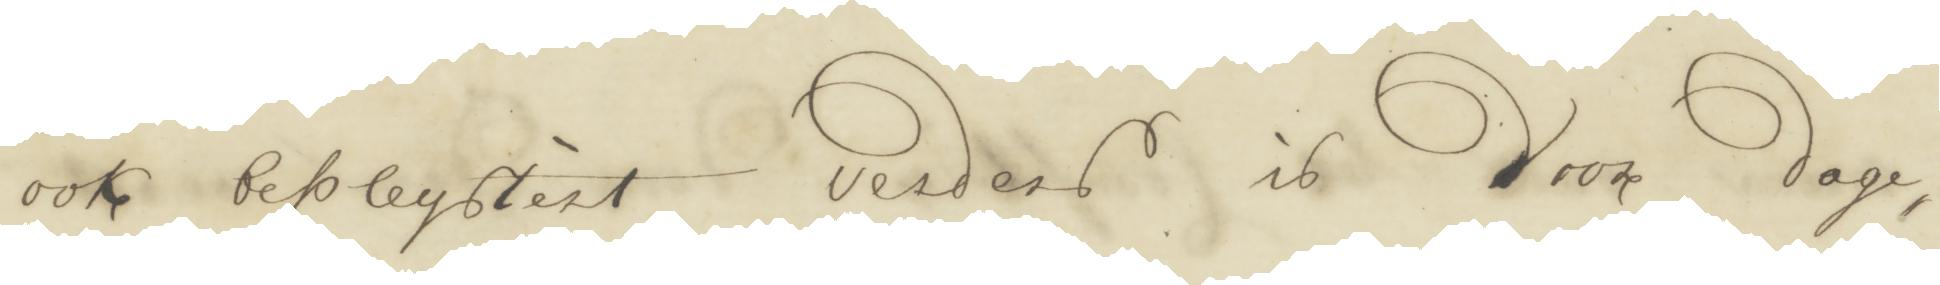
ook bepleystert, verders is door dage„
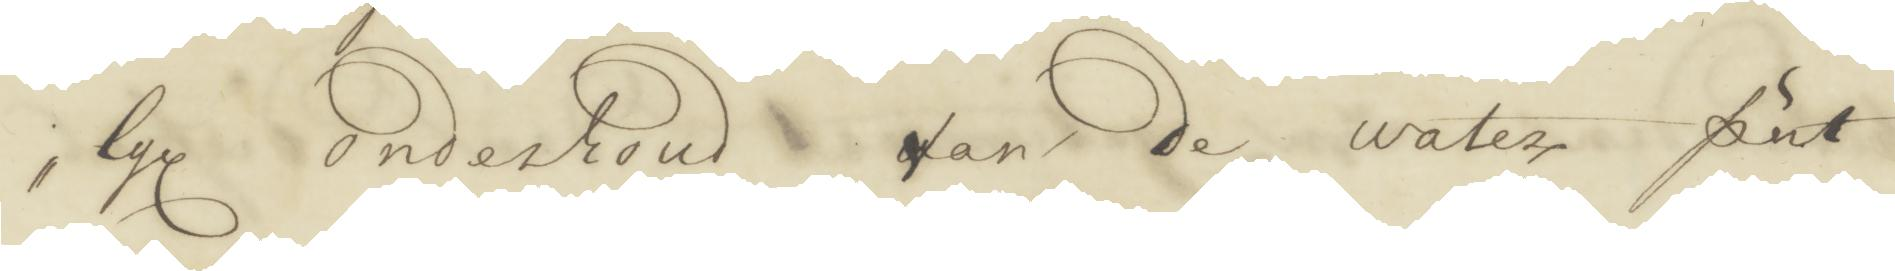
„lyx onderhoud van de water put
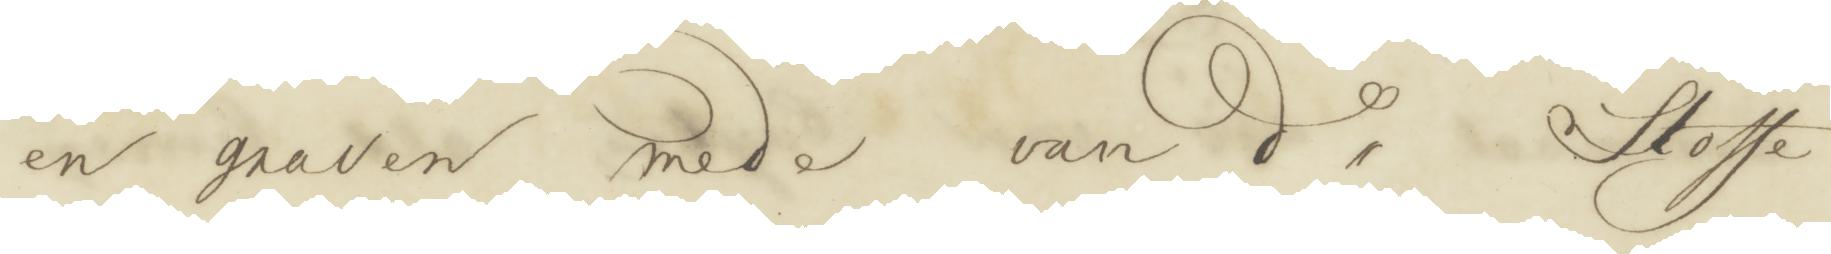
en graven mede van d„e Stoffe
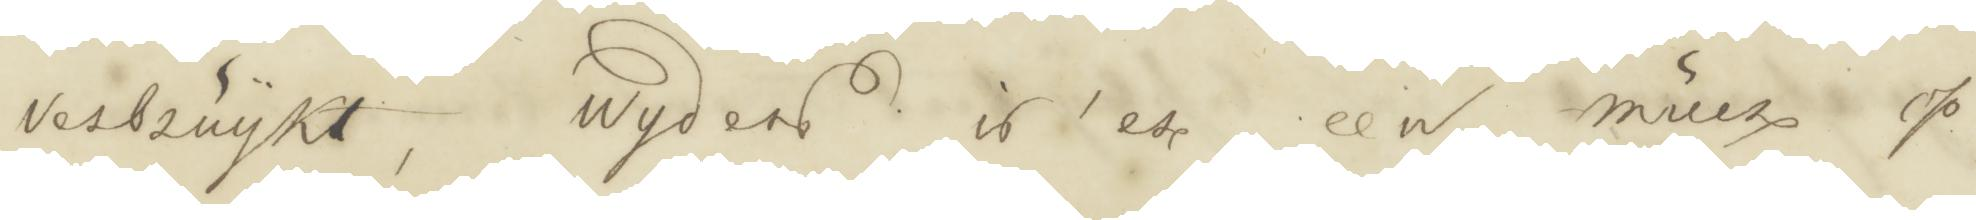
verbruijkt, wyders is 'er een muer op
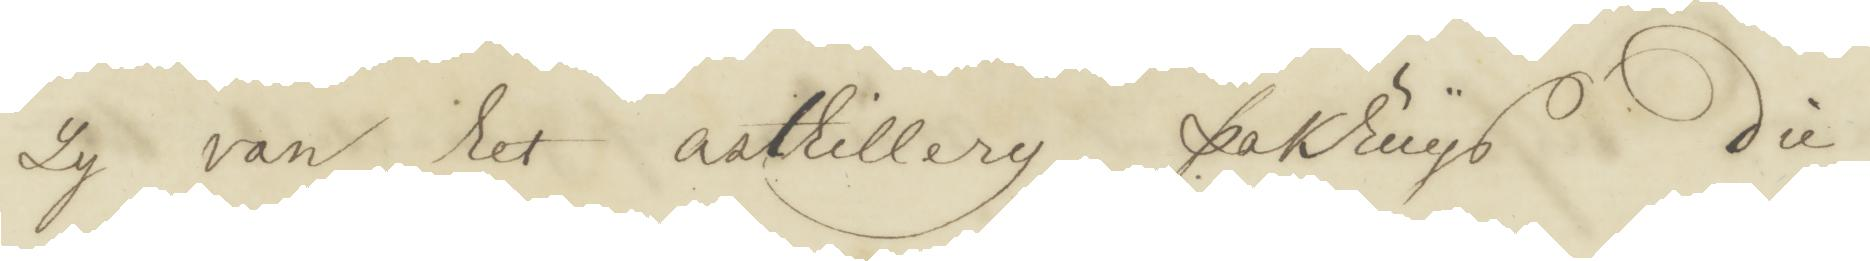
zy van het arthillery pakhuijs die
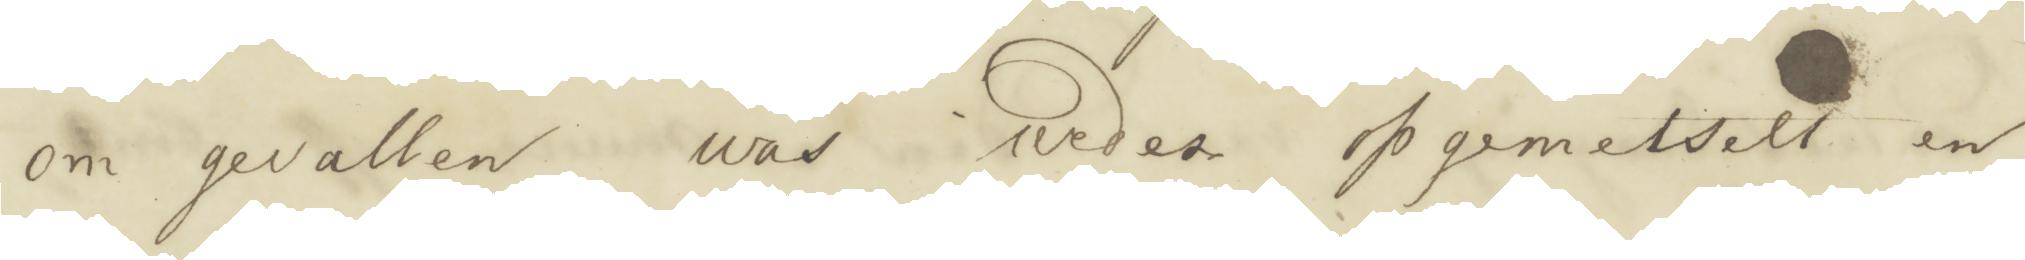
om gevallen was weder opgemetselt en
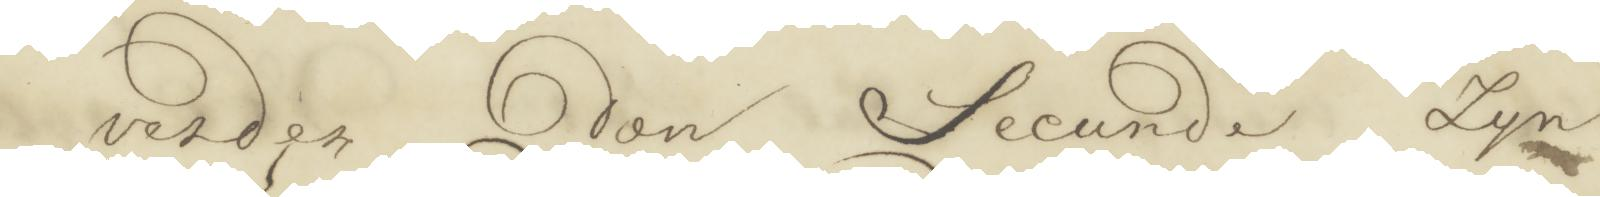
verder den Secunde zijn
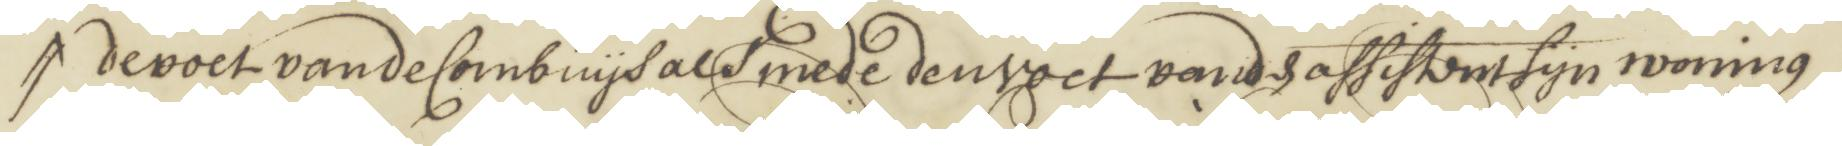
de voet van de combuijs als mede den voet vanden assistent sijn woning
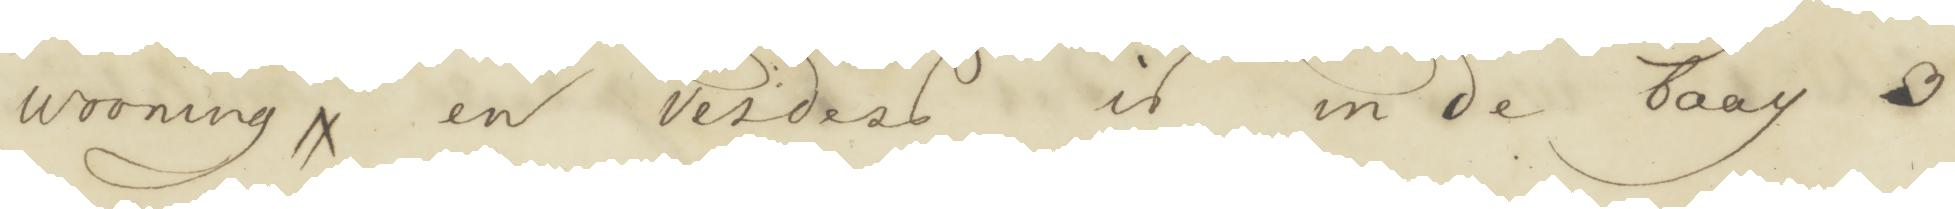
wooning „ en verders is in de baay 3
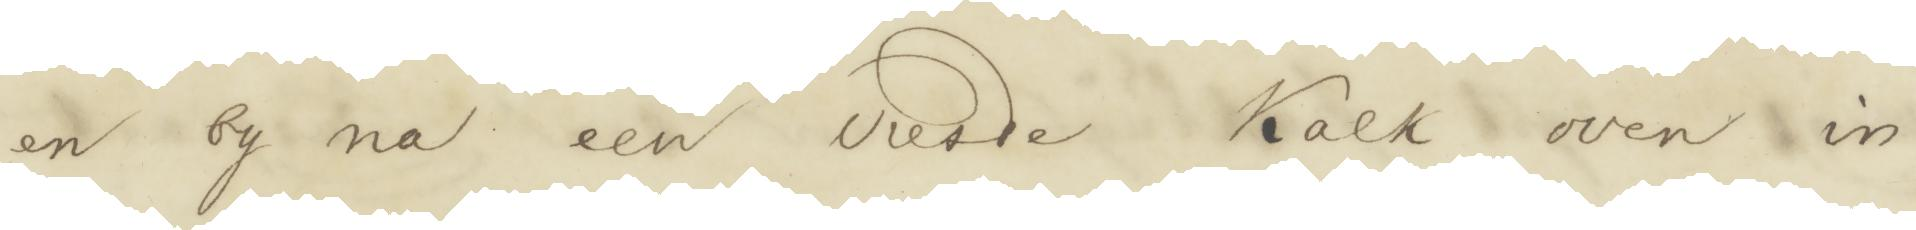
en by na een vierde kalk oven in
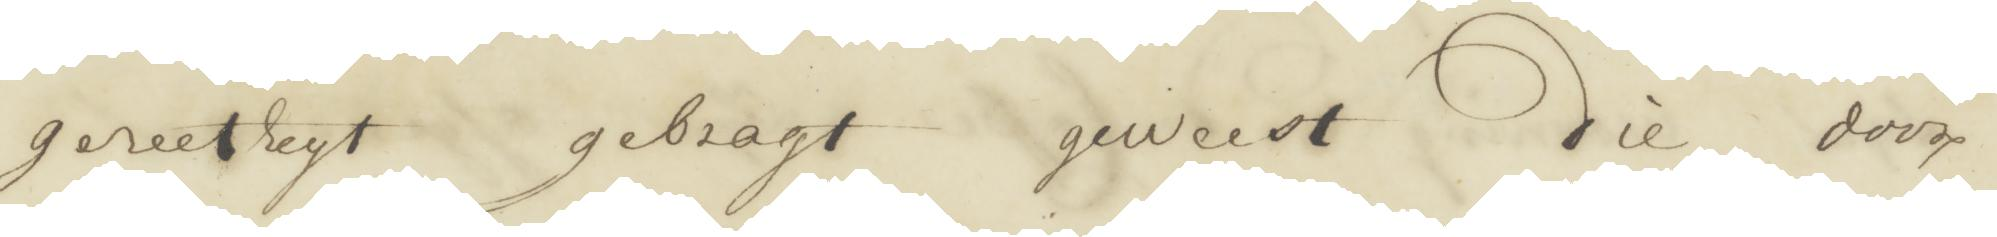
gereetheyt gebragt geweest die door
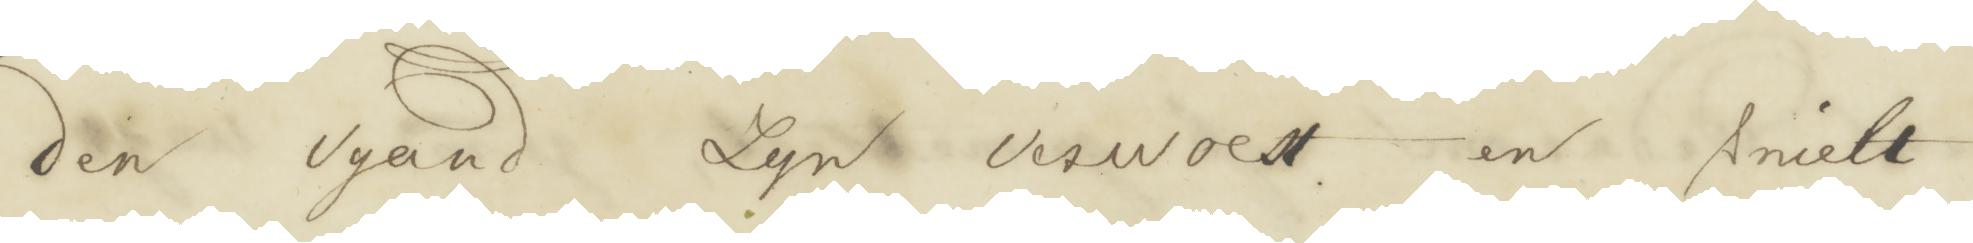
den vyand zyn verwoest en vernielt
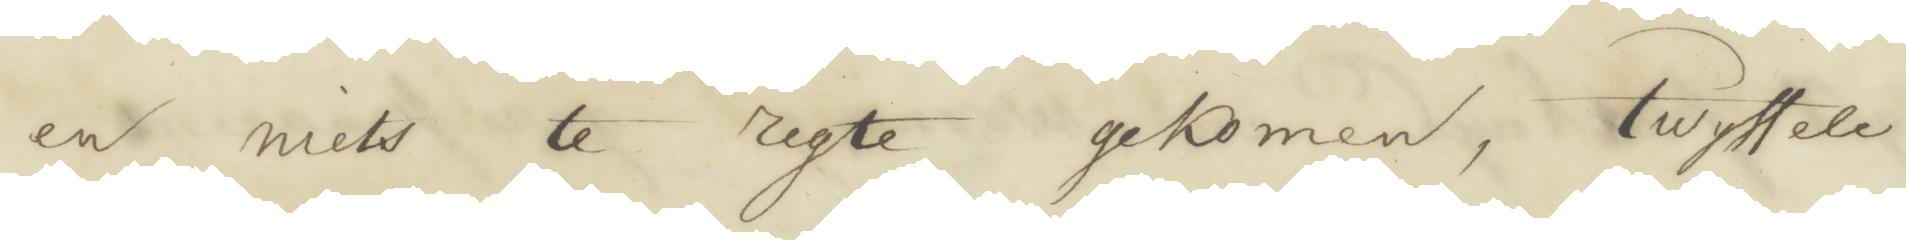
en niets te regte gekomen, twyffele
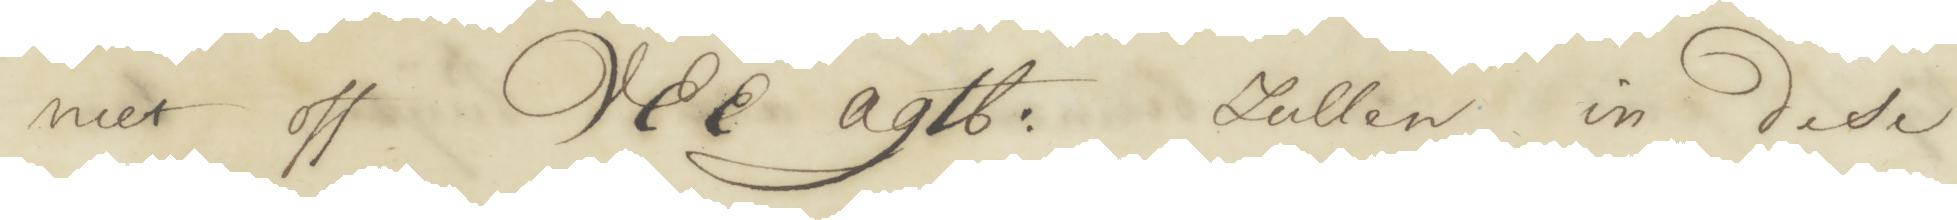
niet off VEE agtb: zullen in dese
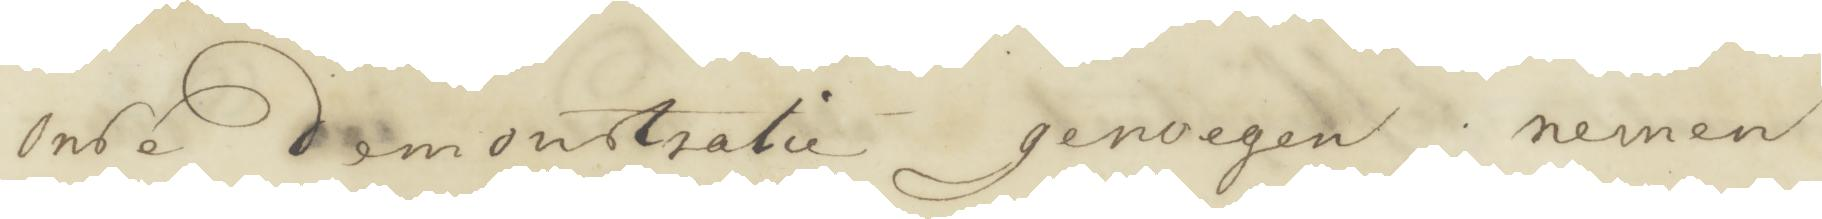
onse demonstratie genoegen nemen
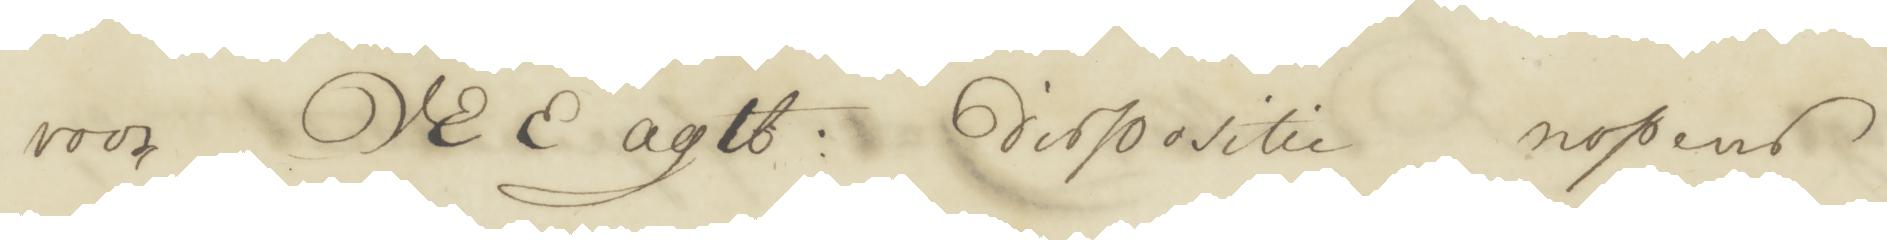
voor VE E agtb: dispositie nopens
